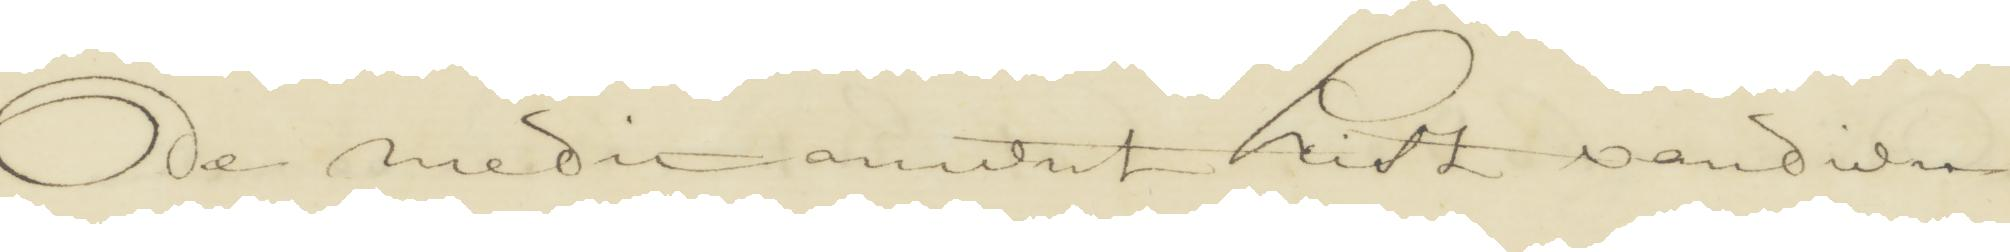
de medicament kist van dien
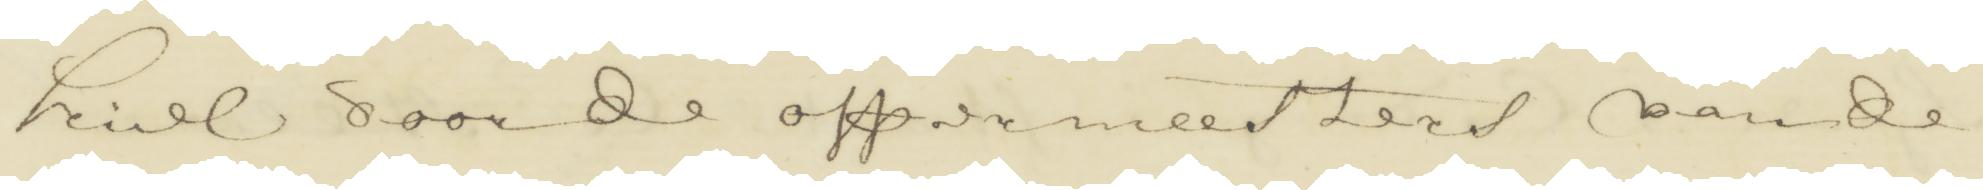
kiel door de oppermeesters van de
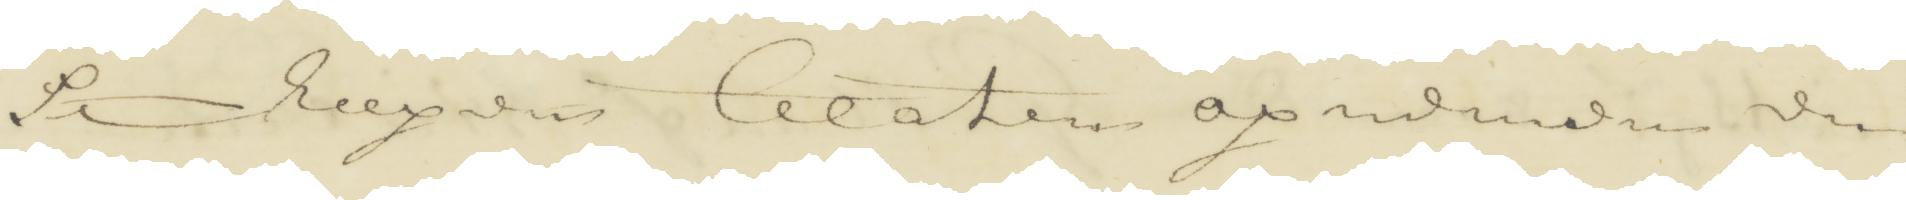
scheepens te laten op nemen en
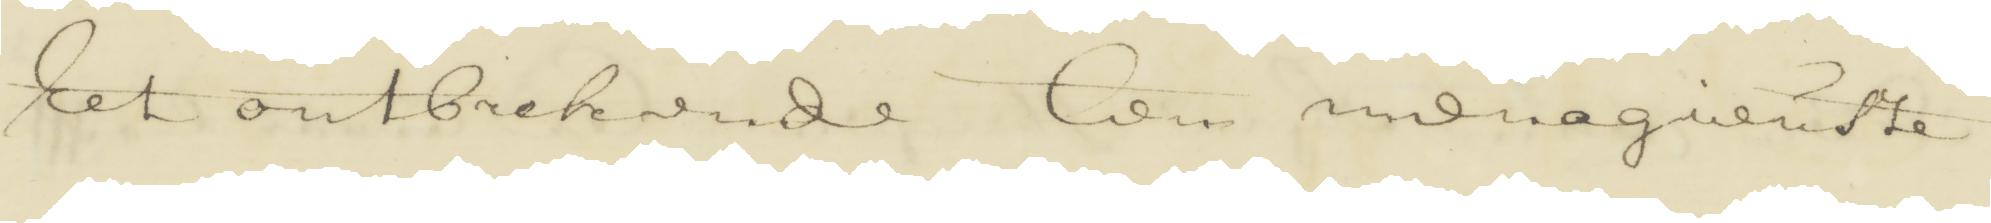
het ontbrekende ten menagieuste
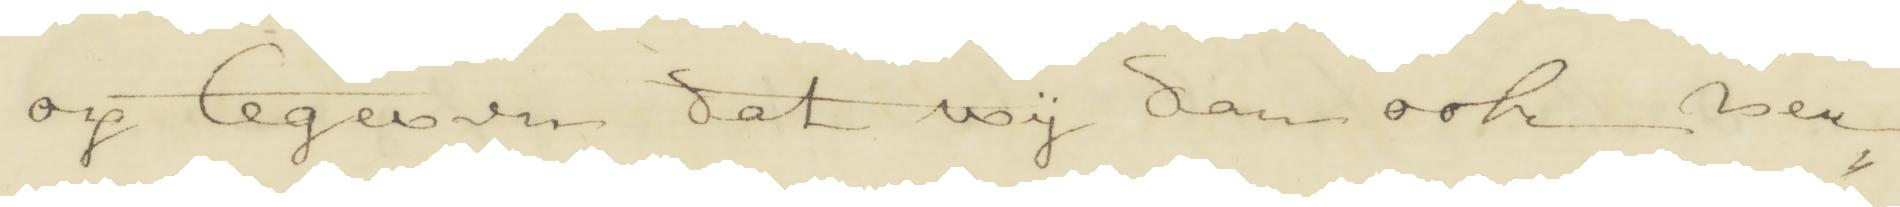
op tegeven, dat wij dan ook ver„
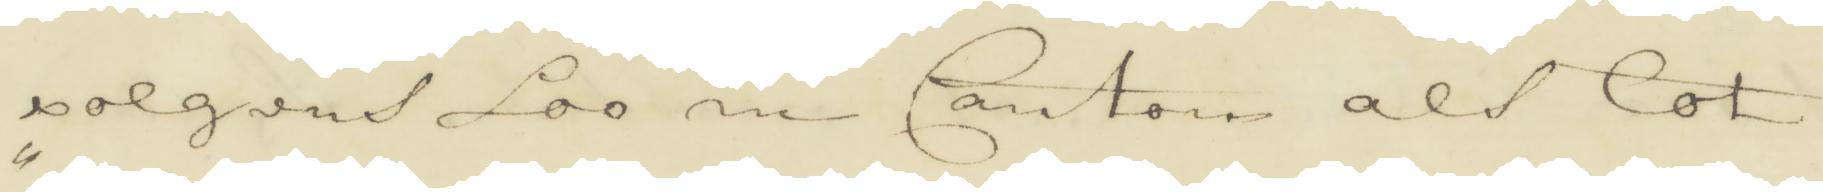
„volgens soo in Canton als tot
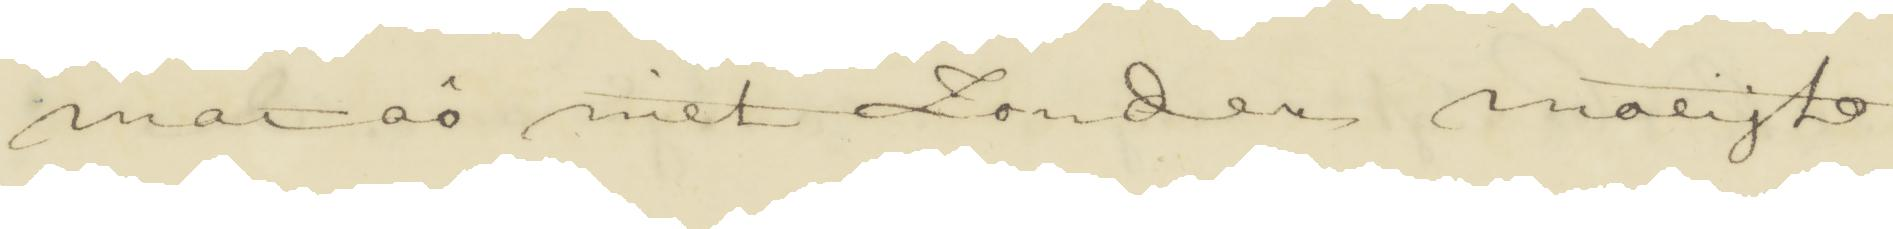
macaô niet zonder moeijte
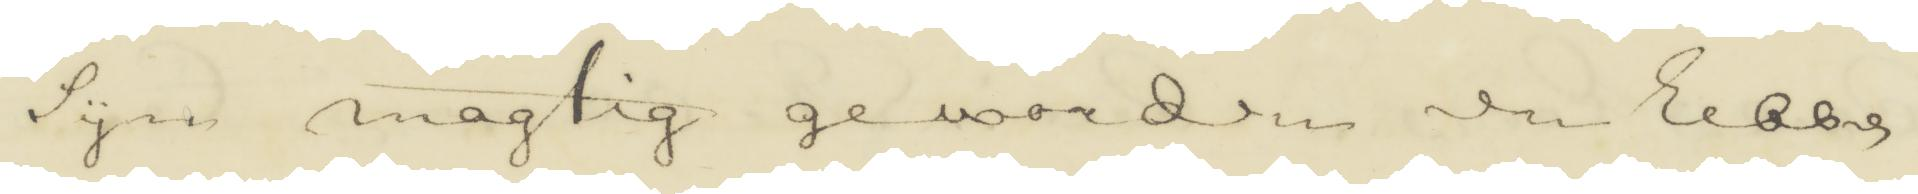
sijn magtig geworden en hebben
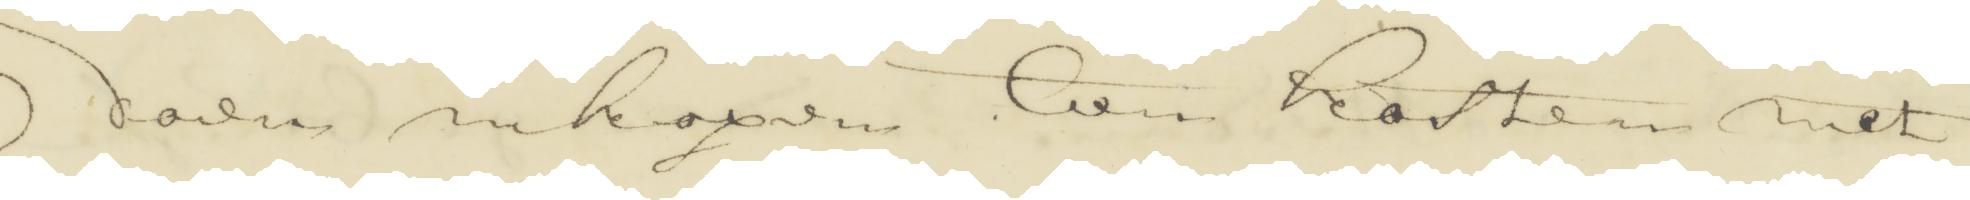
doen inkopen ten kosten met
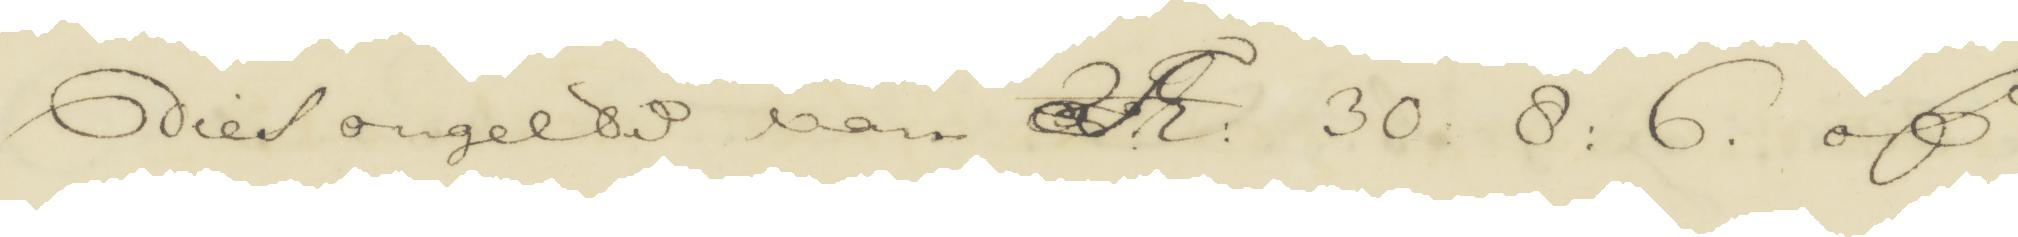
dies ongelde van t:k: 30: 8: 6. of
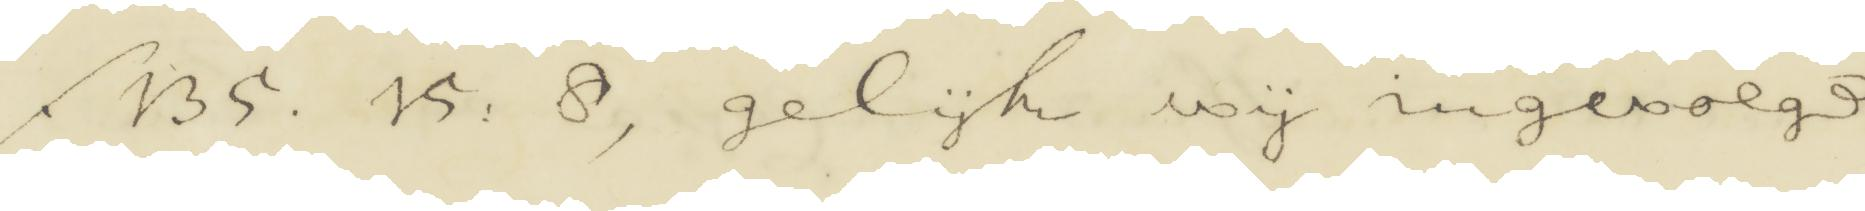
ƒ135. 15: 8, gelijk wij ingevolge
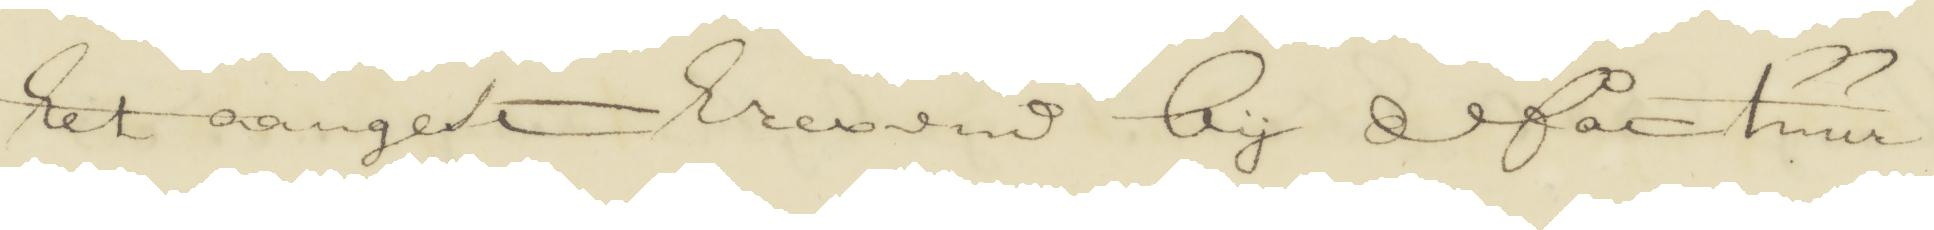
het aangeschrevene bij de factuur
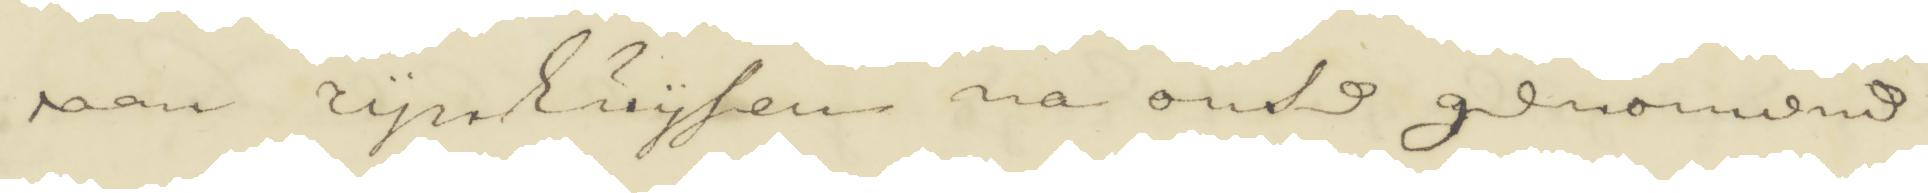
van rijnhuijsen na onse genomene
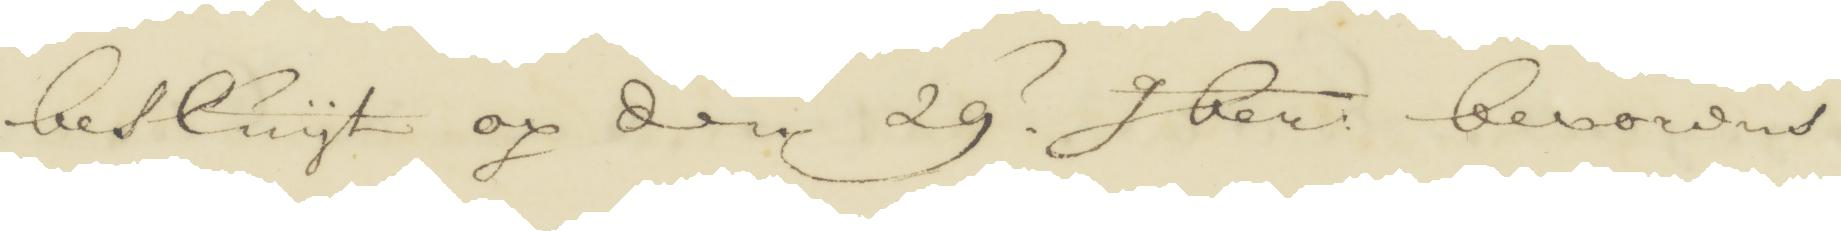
besluijt op den 29.' 9ber: bevorens
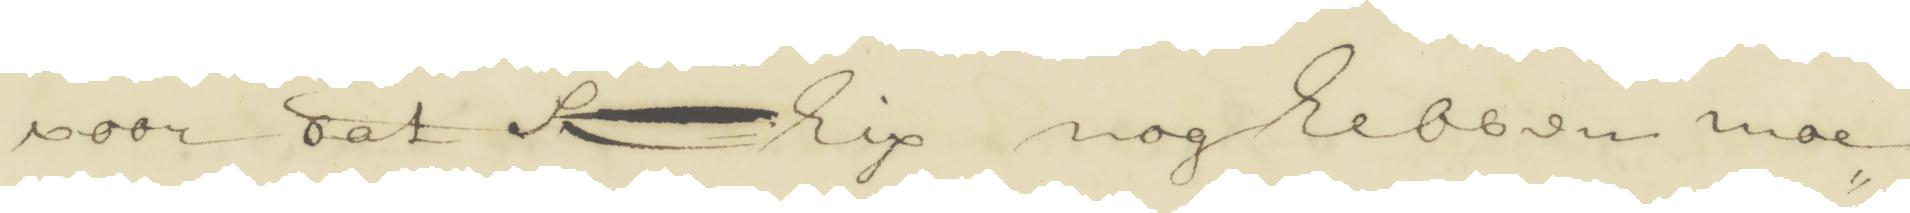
voor dat schip nog hebben moe„
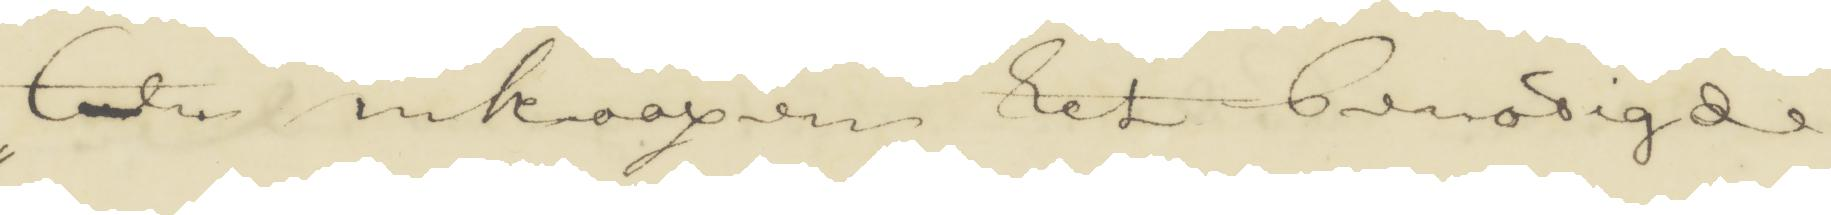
„ten inkoopen, het benodigde
